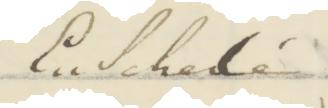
Enschedé
